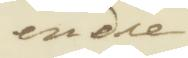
en die
